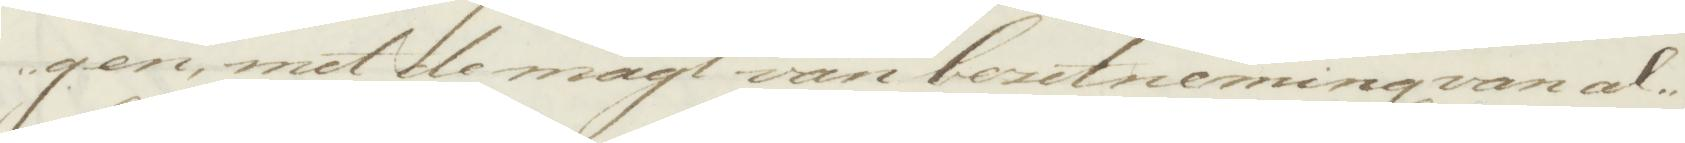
„gen, met de magt van bezitneming van al„
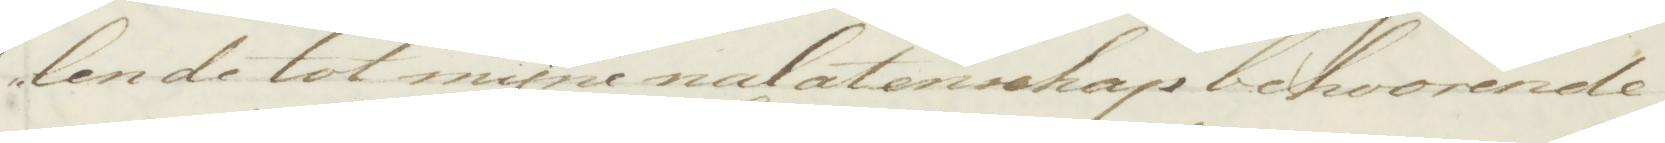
„len de tot mijne nalatenschap behoorende
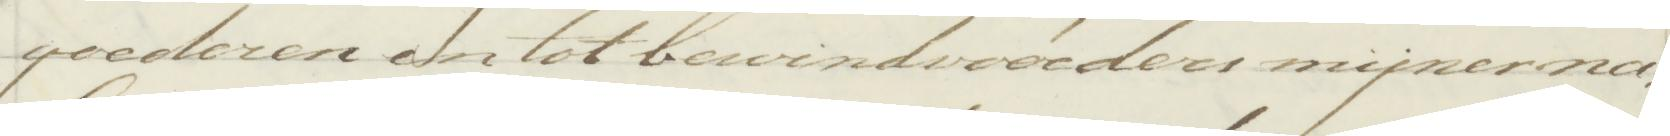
goederen en tot bewindvoerders mijner na„
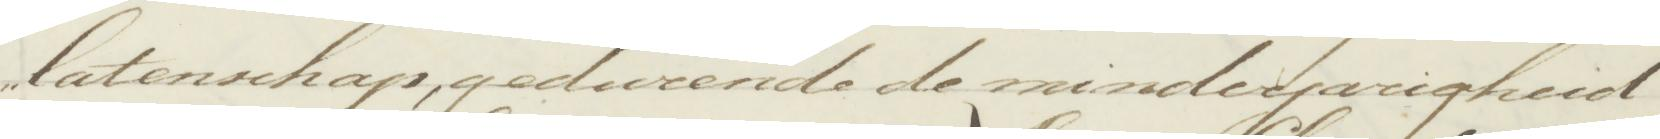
„latenschap, gedurende de minderjarigheid
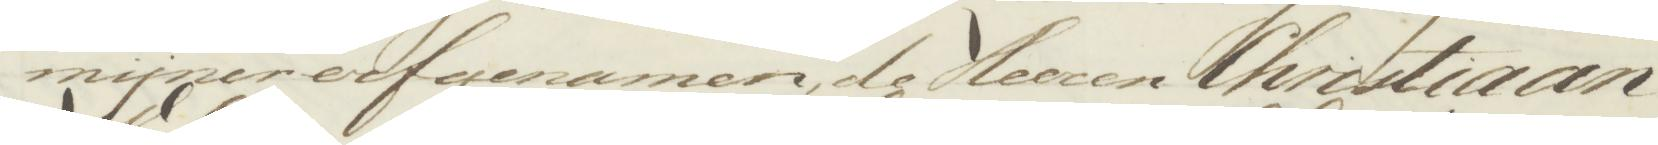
mijner erfgenamen, de Heeren Christiaan
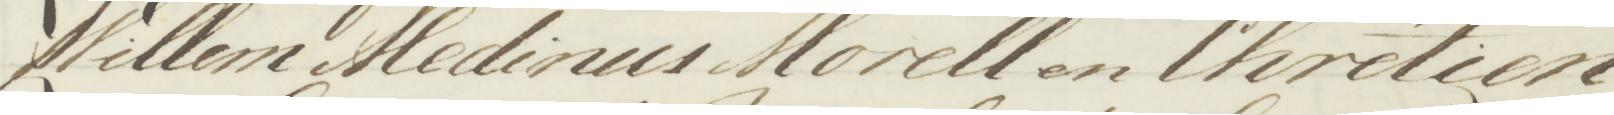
Willem Medinus Morell en Chretien
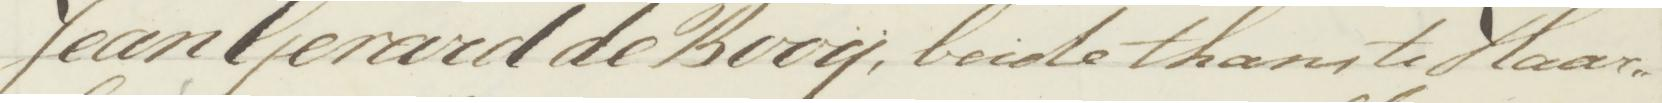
Iean Gerard de Booij, beide thans te Haar„
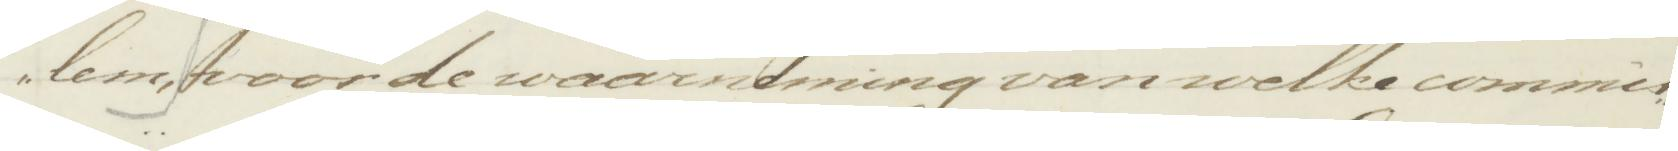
„lem, voor de waarneming van welke commis„
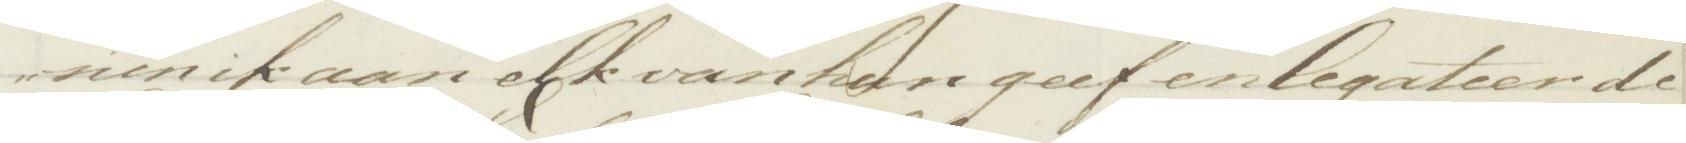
siën ik aan elk van hun geef en legateer de
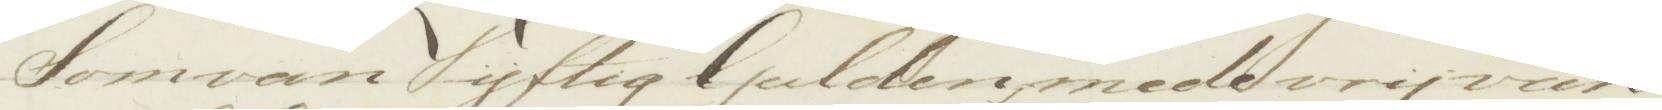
Som van Vijftig Gulden, mede vrij van
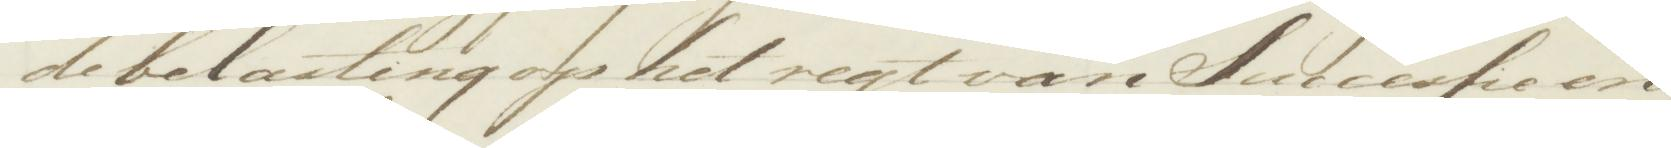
de belasting op het regt van Successie en
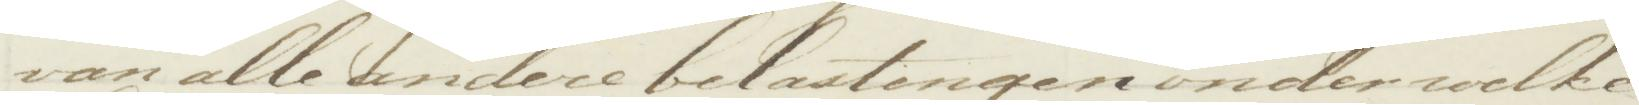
van alle andere belastingen onder welke
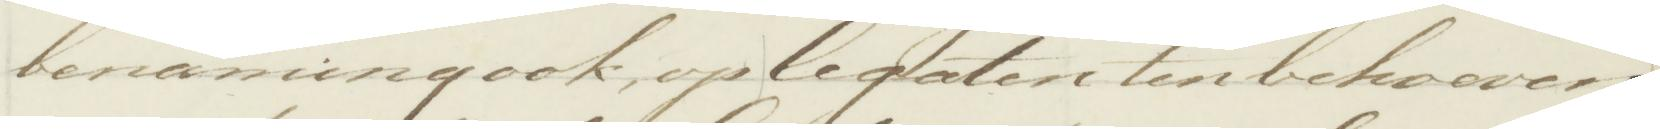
benaming ook, op legaten ten behoeven
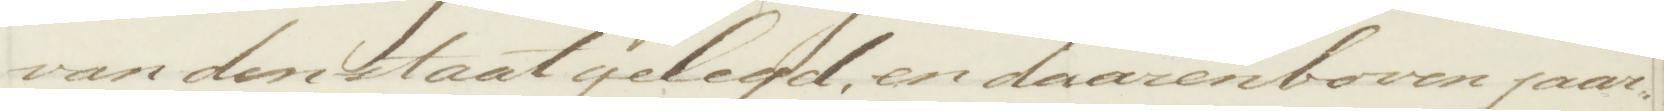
van den staat gelegd, en daarenboven jaar„
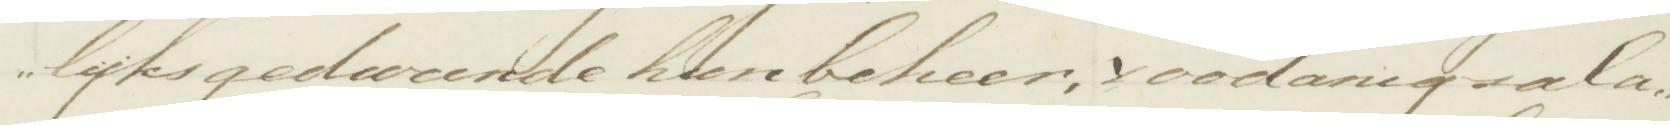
„lijks gedurende hun beheer, zoodanig sala„
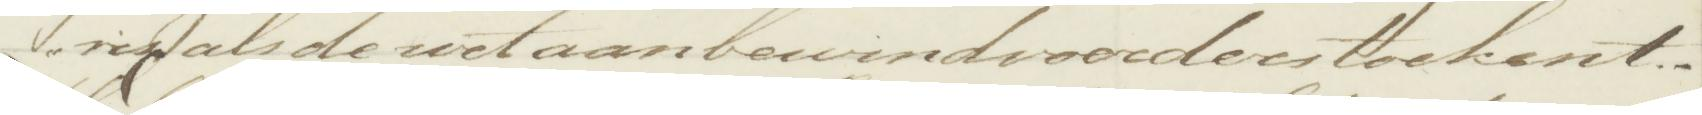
„ris als de wet aan bewindvoerders toekent. -
